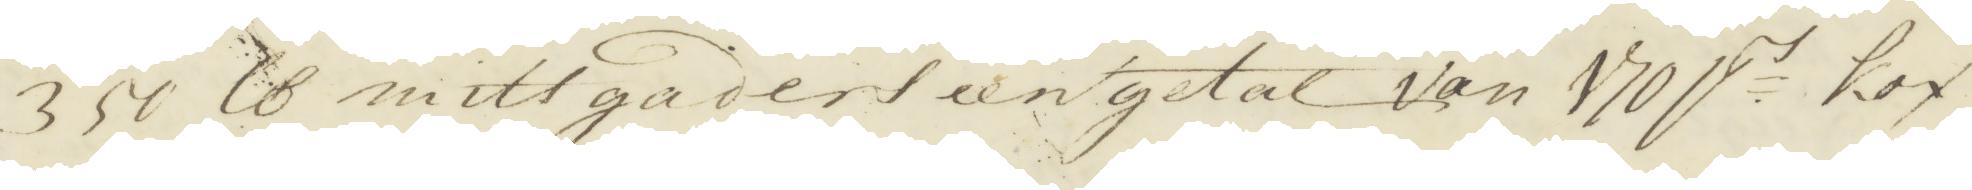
350 lb mitsgaders een getal van 170 p=s kox
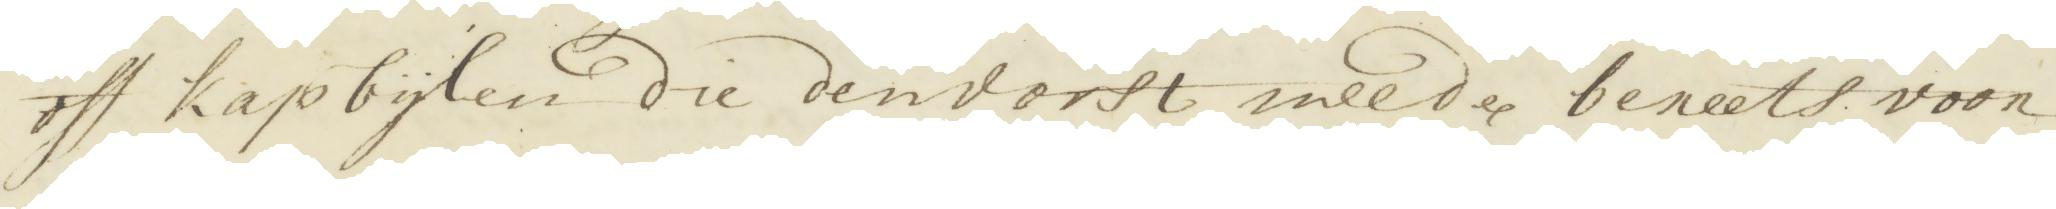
off kapbijlen die den vorst meede bereets voor
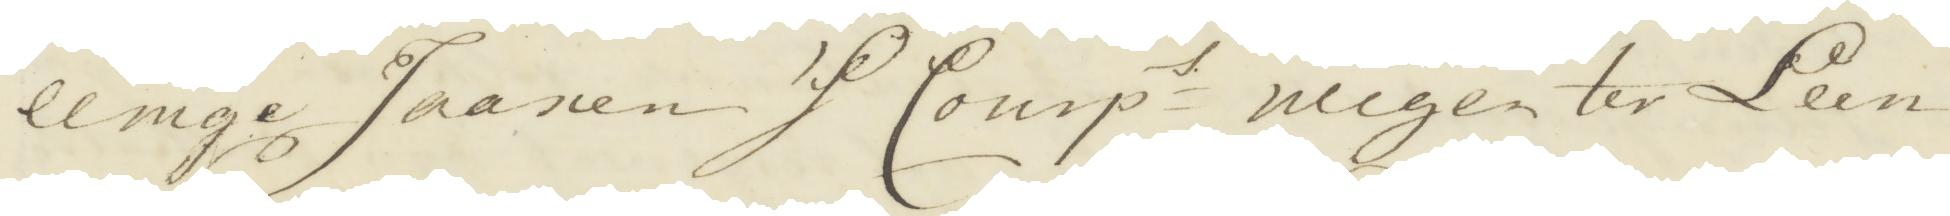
eenige Jaaren ’s Comp=s wegen ter Leen
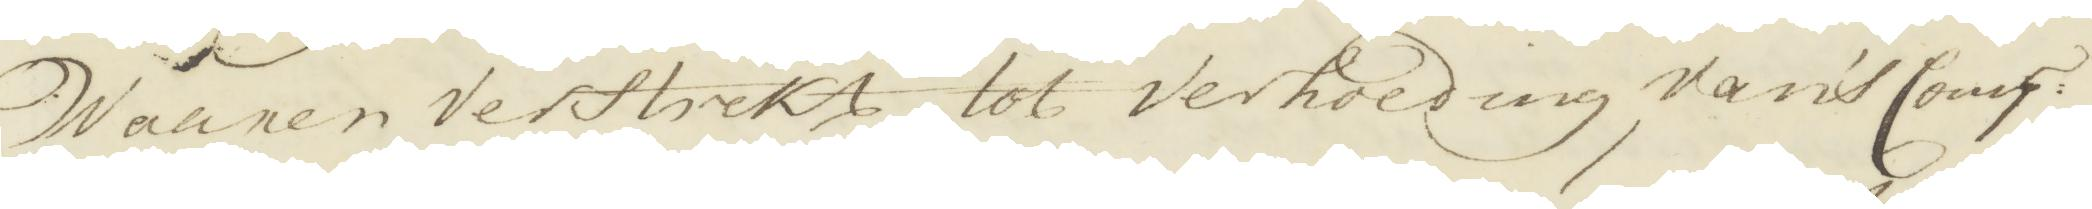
waaren verstrekt tot verhoeding van’s Comp:
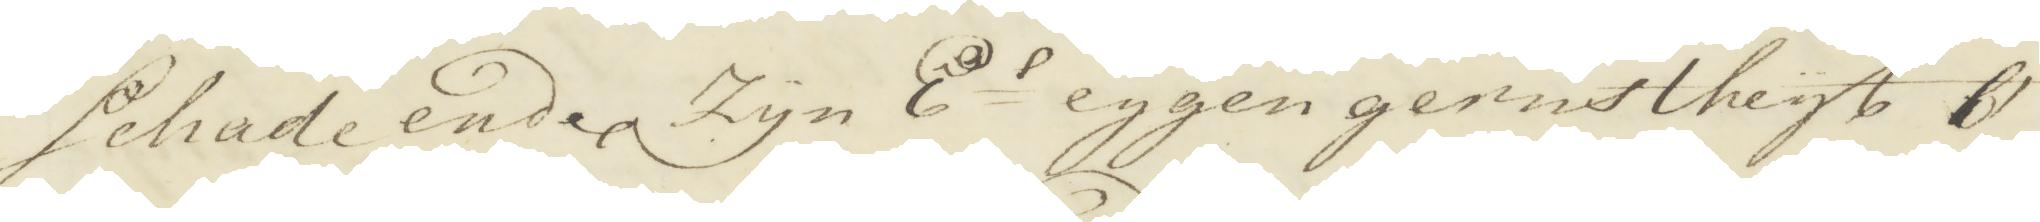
schade ende zijn E=s eijgen gerustheijt b'
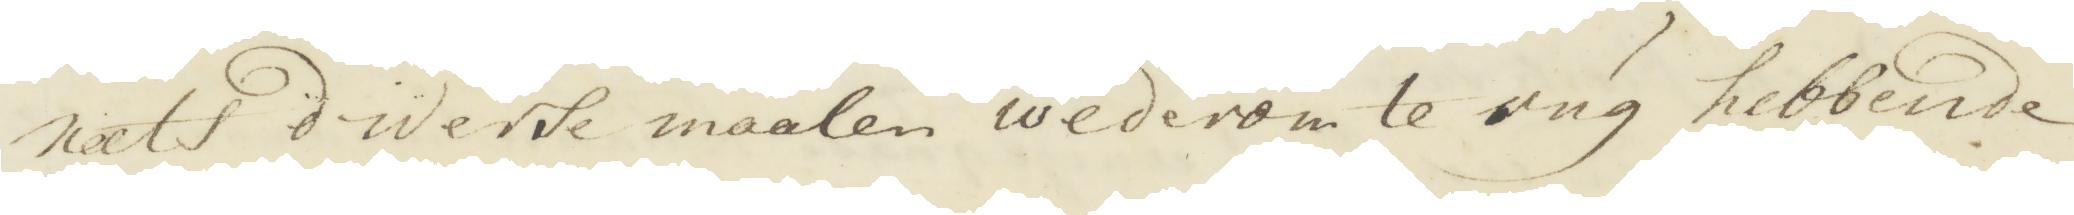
reets diverse maalen wederom te rug hebbende
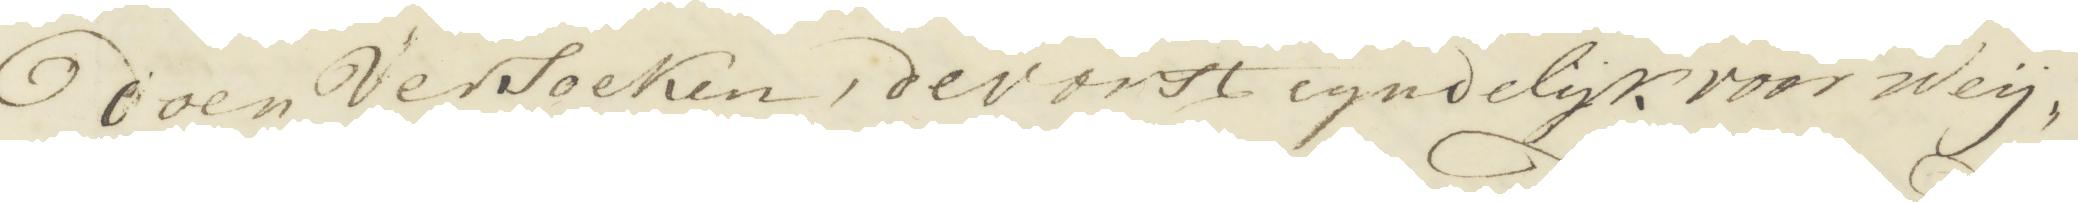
doen versoeken, de vorst eyndelijk voor weij„
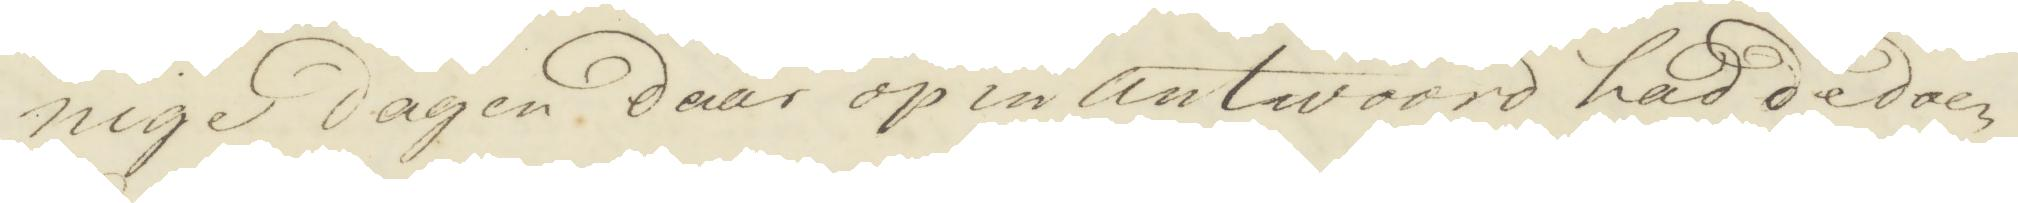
nige dagen daar op in antwoord hadde doen
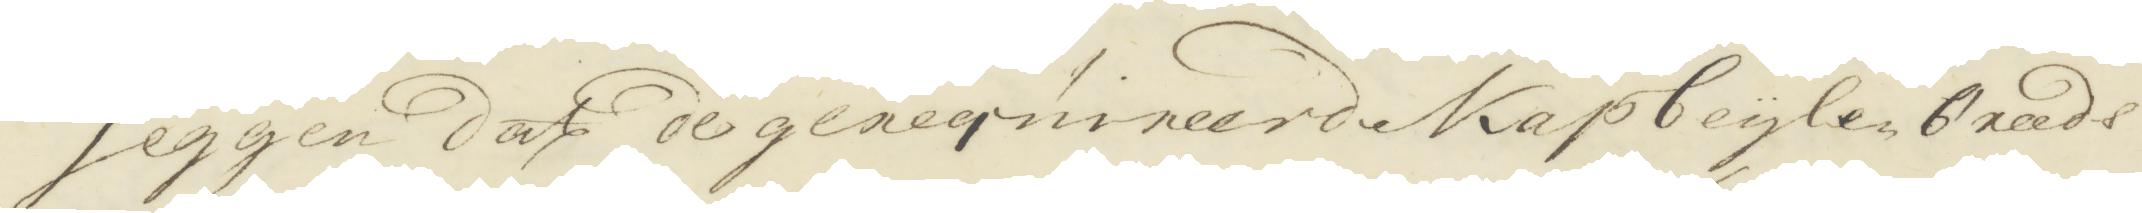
seggen dat de gerequireerde kapbeijlen b'reeds
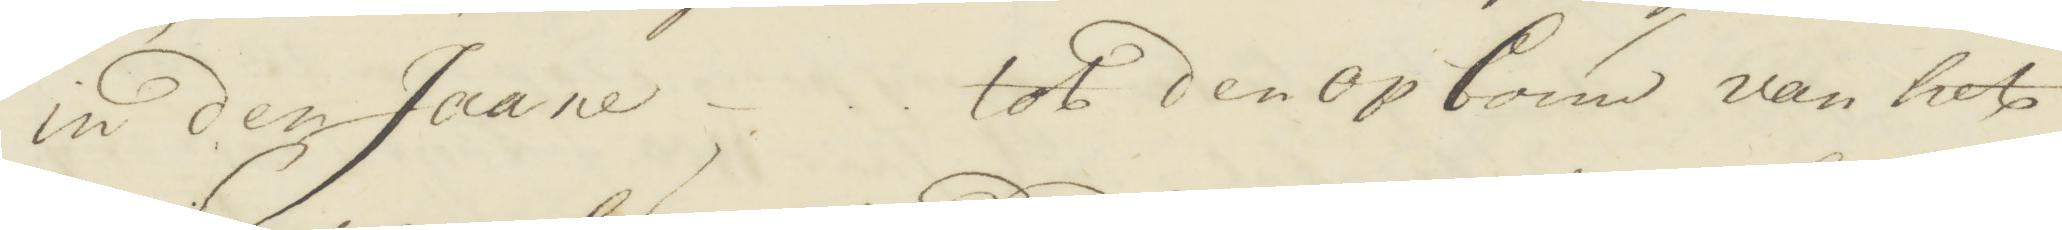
in den Jaare tot den opbouw van het
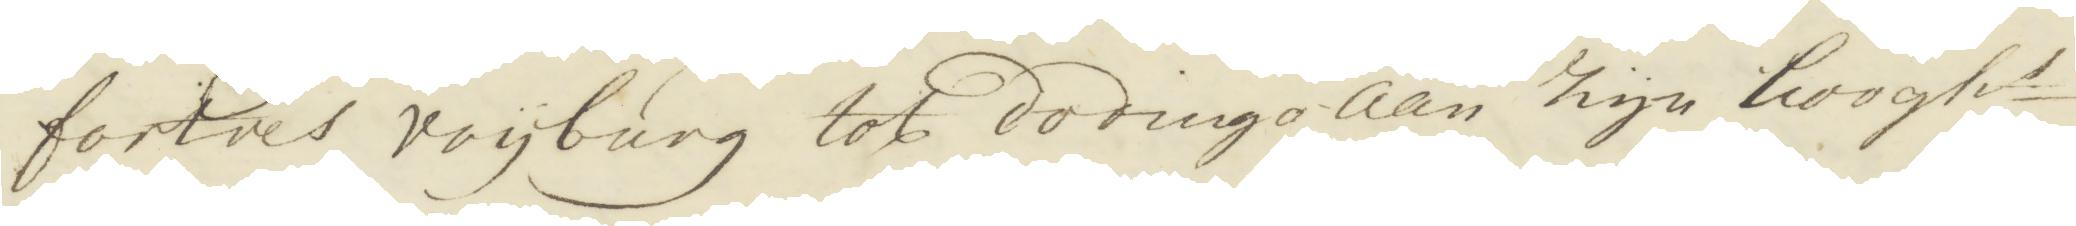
fortres voijburg tot dodingo aan zijn hoogh=t
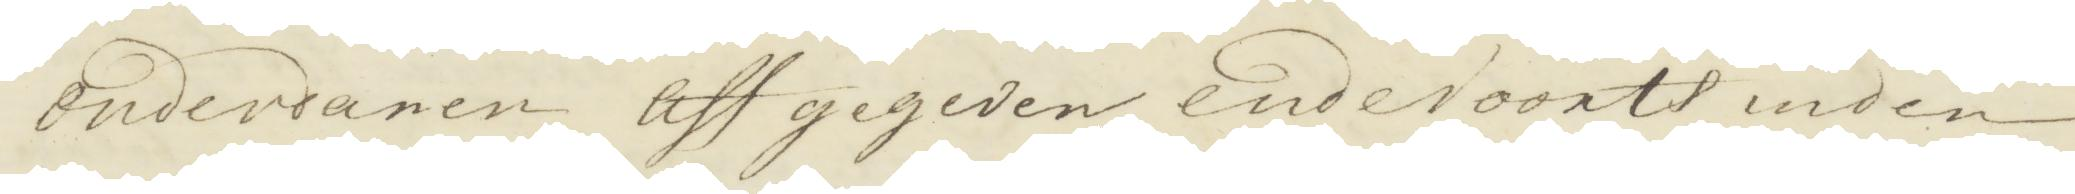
onderdanen affgegeven ende voorts inden
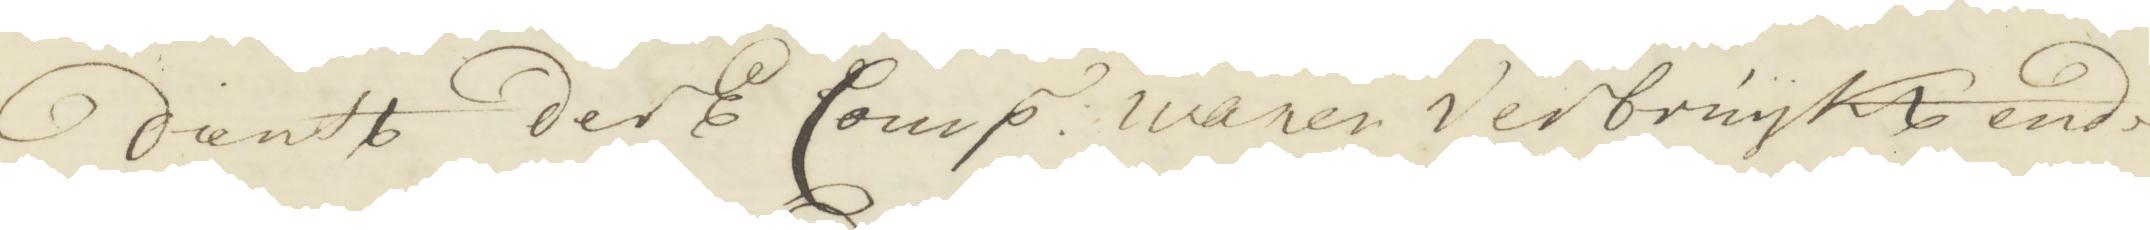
dienst des E Comp:s waren verbruijkt ende
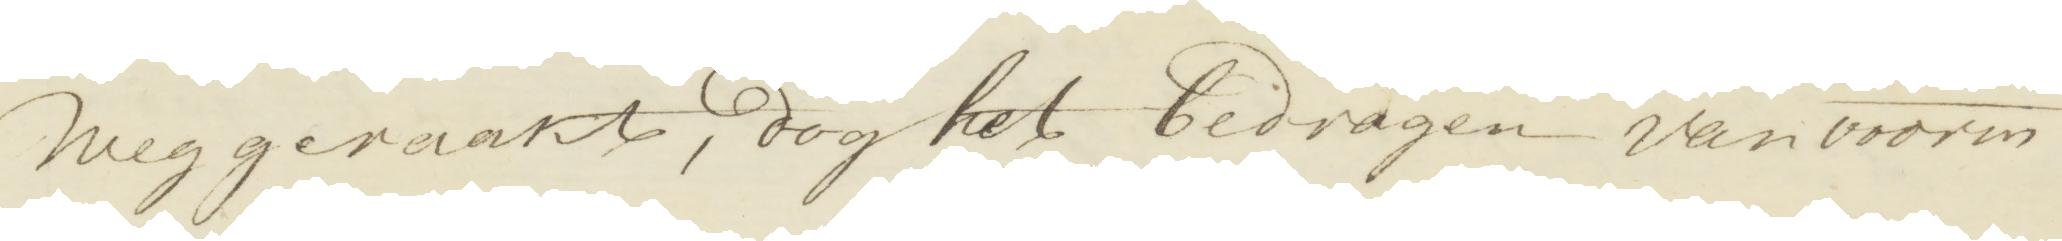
weggeraakt, dog het bedragen van voorm
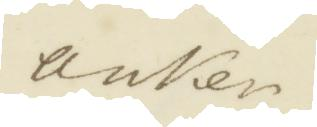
anker
